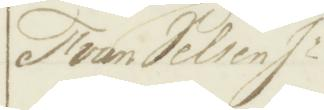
F van Velsen Jr
